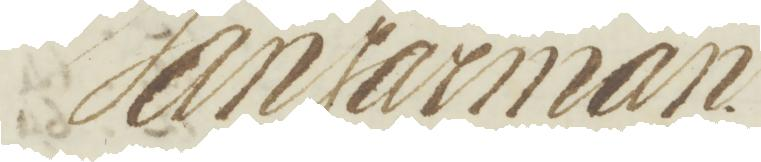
Jan Jarman.
